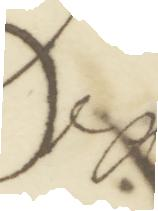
Va
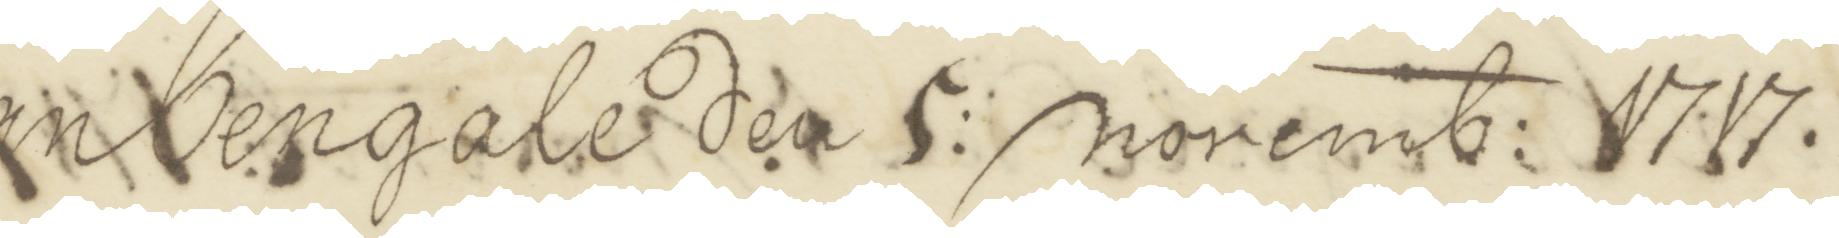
n Bengale den 5: novemb: 1717.
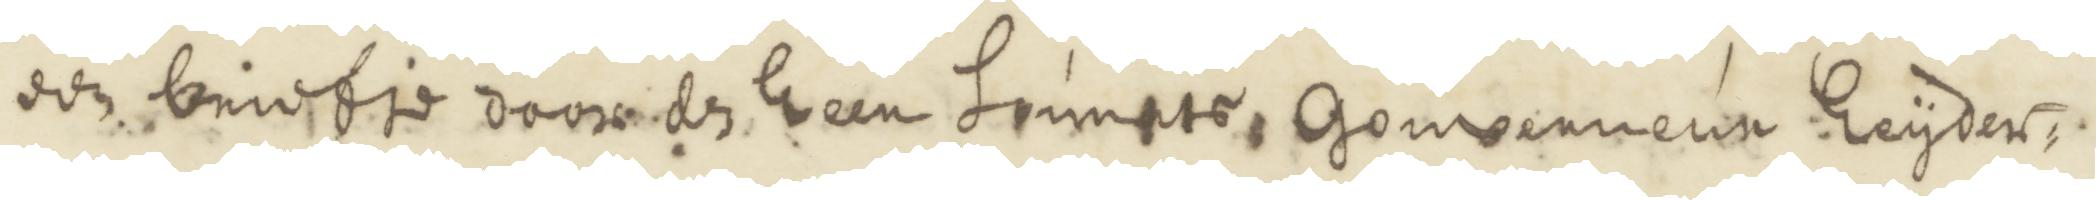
een briefje door den heer Sourats gouverneur heijder„
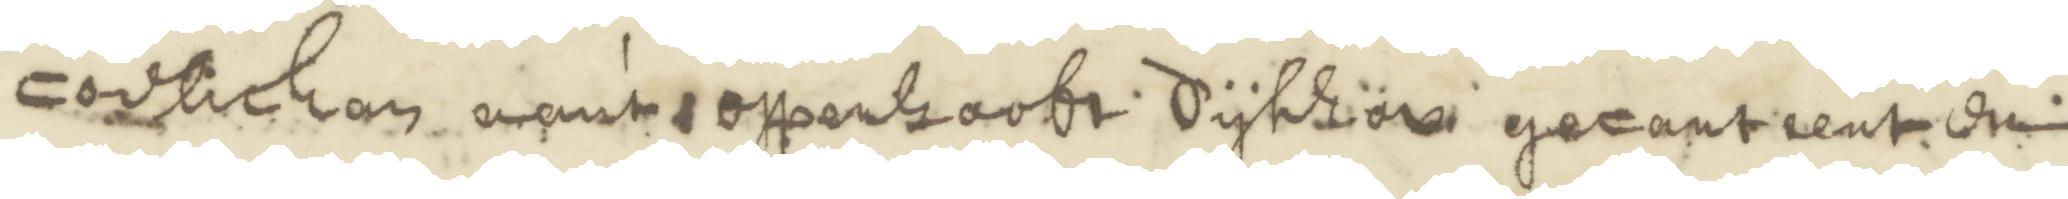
coelichan aan't opperhooft dijkhoe gecarteert en
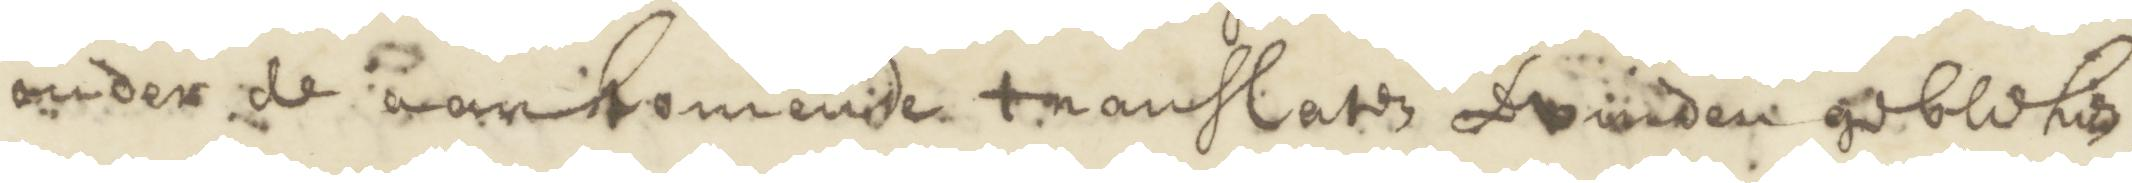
onder de aankomende translaten te vinden gebleken
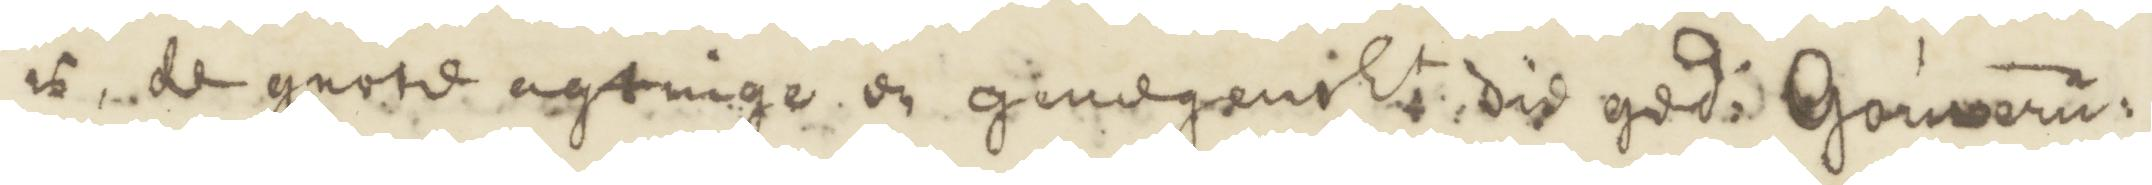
is, de grote agtinge en genegenth:t, die ged: gouvern:r
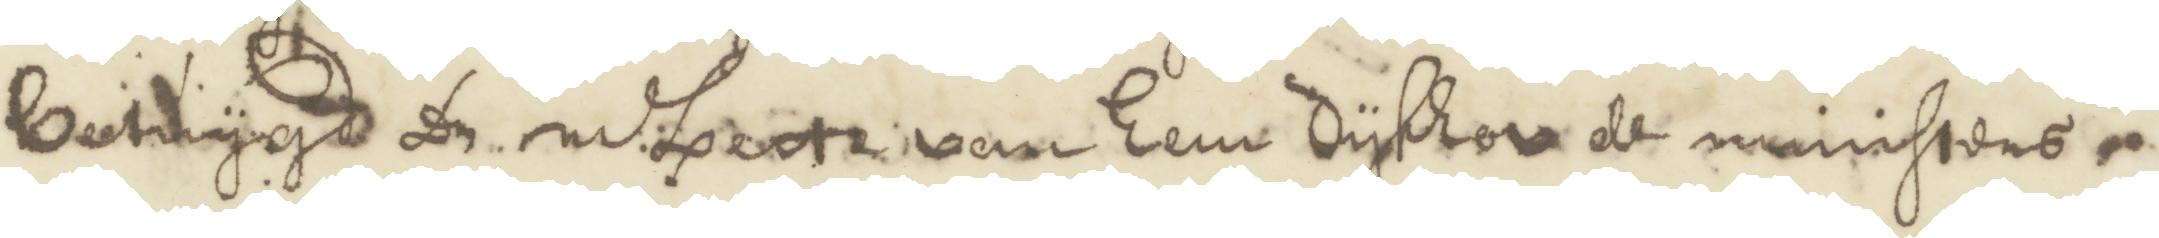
betuijgd ten respecte van hem dijkhoe de ministers
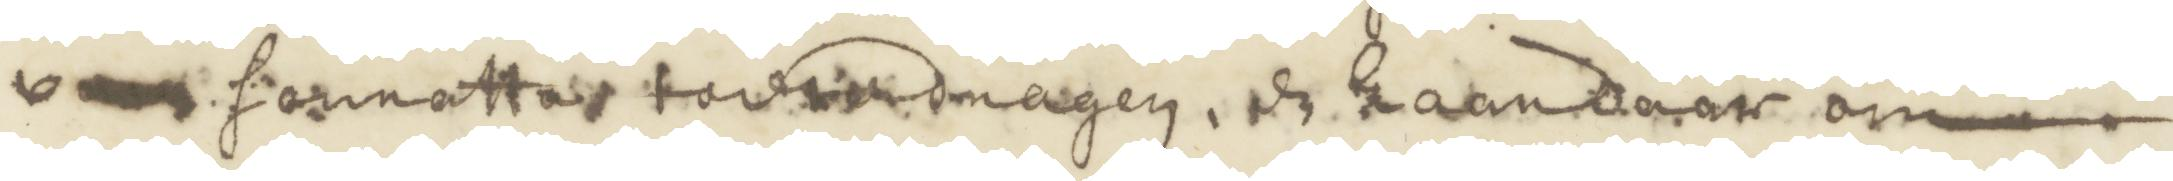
van Souratta toeverdragen, en haar daar om
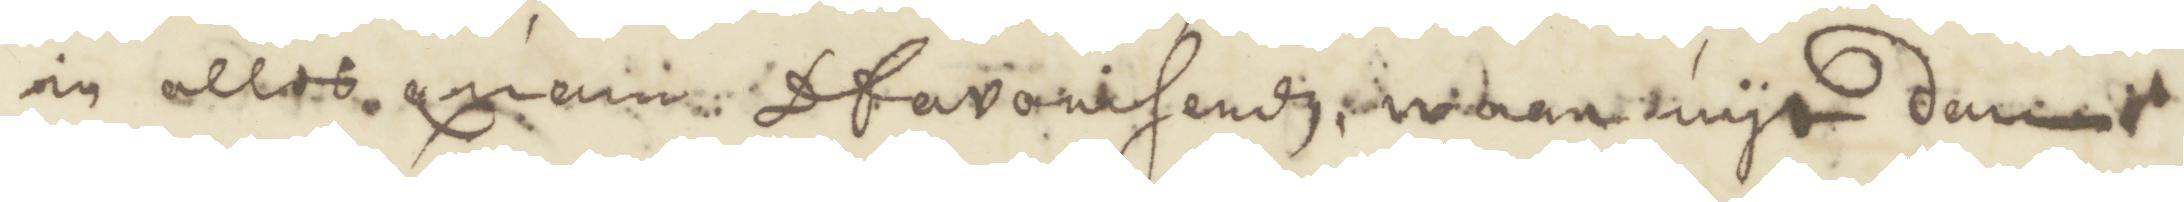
in alles quam te favoriseren, waar uijt dan
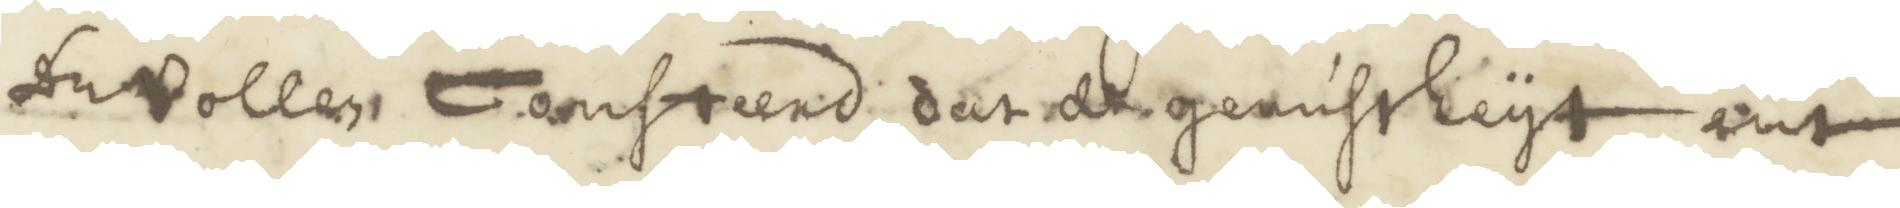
tenvollen consteerd dat de gerustheijt en't
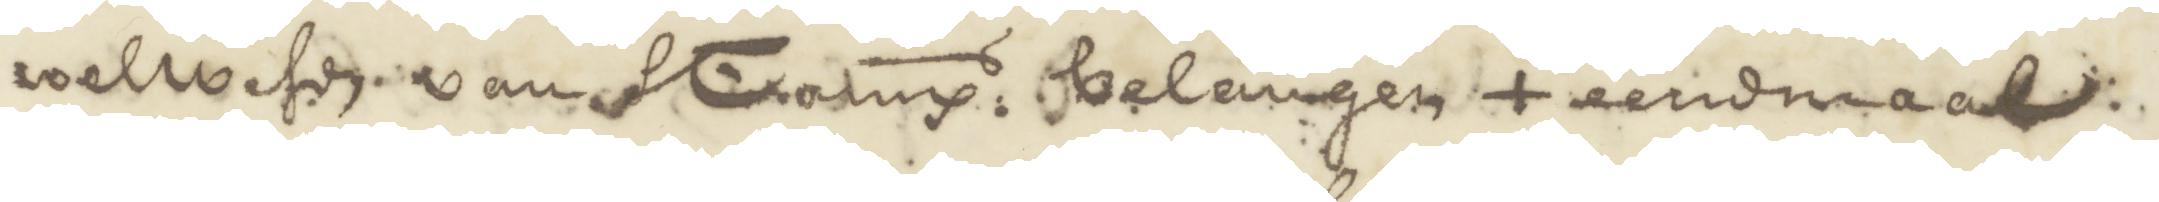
welwesen van 'SComp:s belangen t' eenemaal
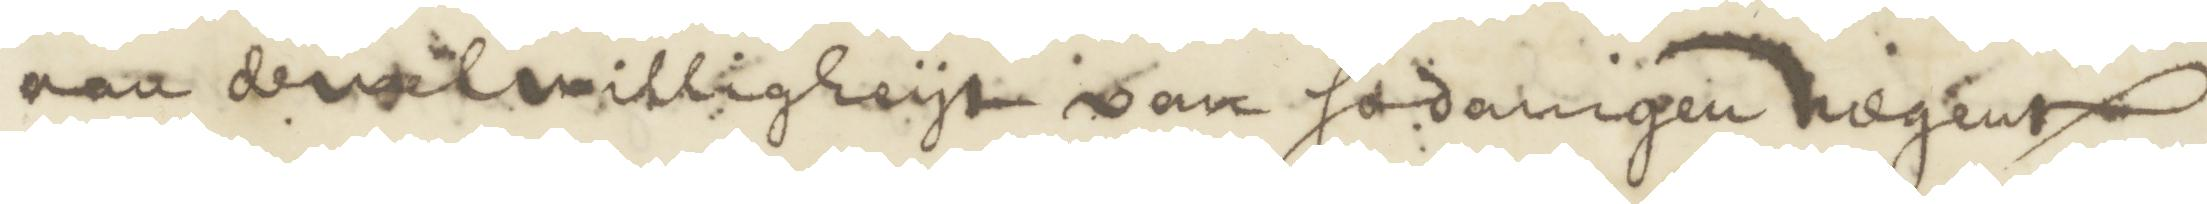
aan de welwilligheijt van sodanigen regent
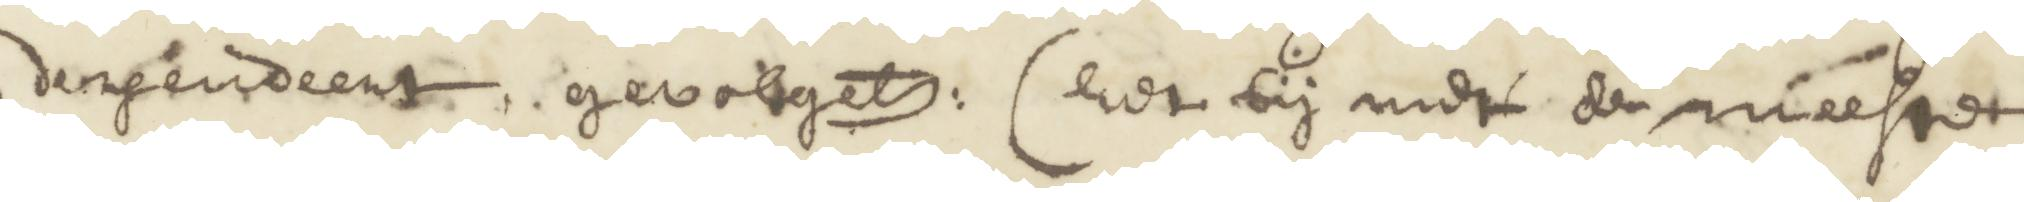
dependeert, gevolgelijk (het sij met de meeste
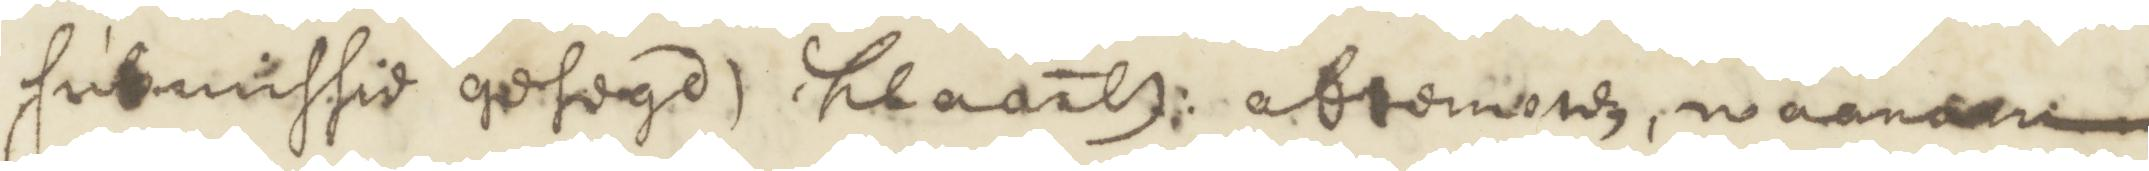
submissie gesegd) klaarlijk afteweten, waaraan
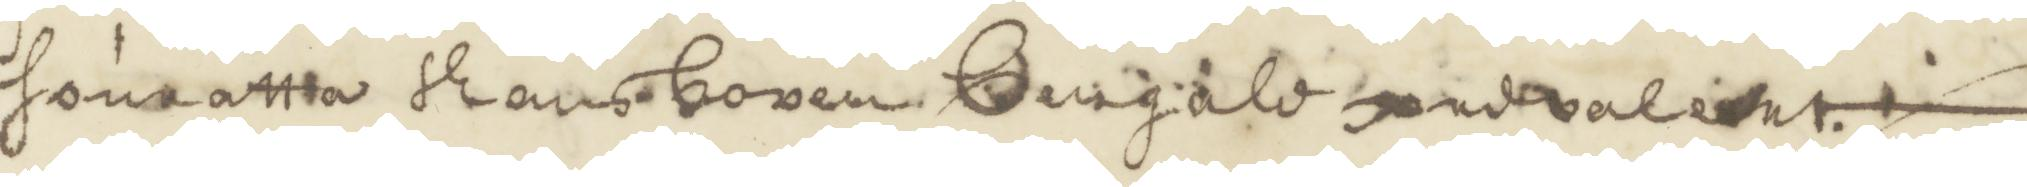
sourattta thans boven Bengale prevaleert.
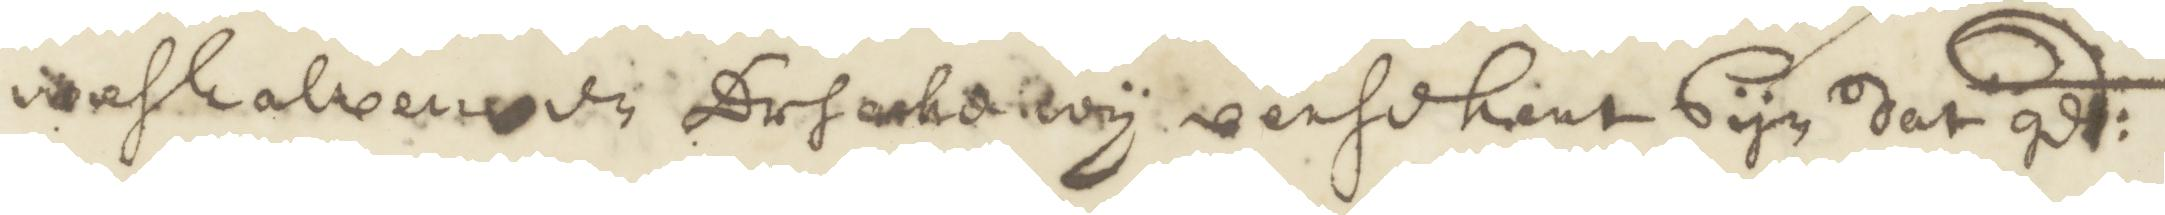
weshalven en tersacke wij versekert sijn dat ged:
